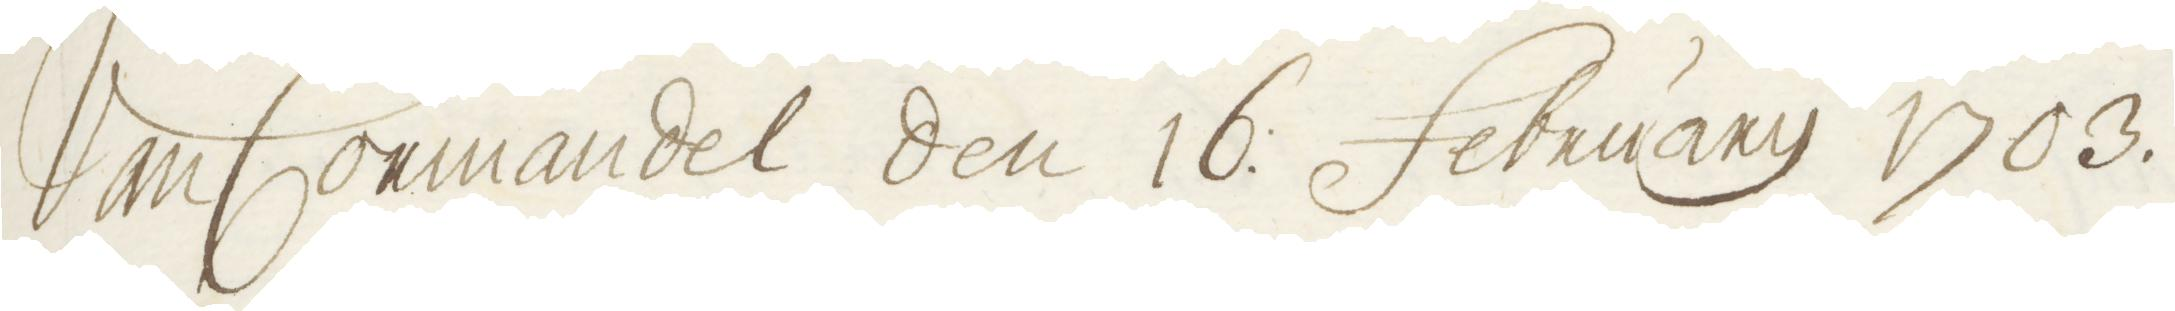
Van Cormandel den 16: Februarij 1703.
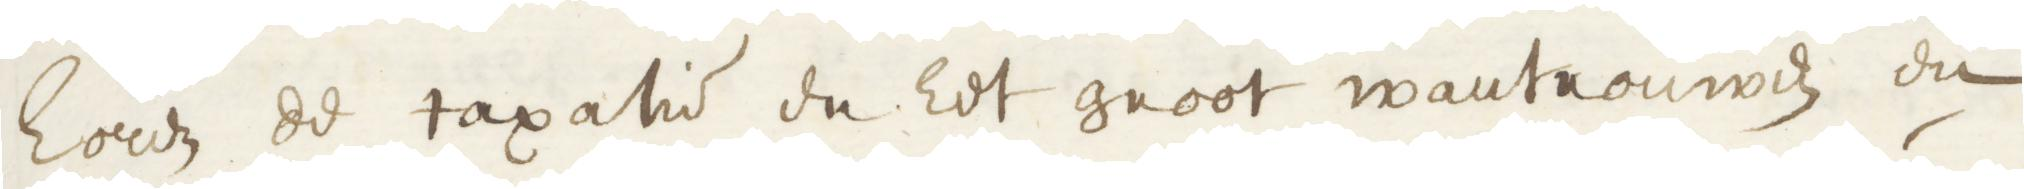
horen de taxatie en het groot wantrouwen en
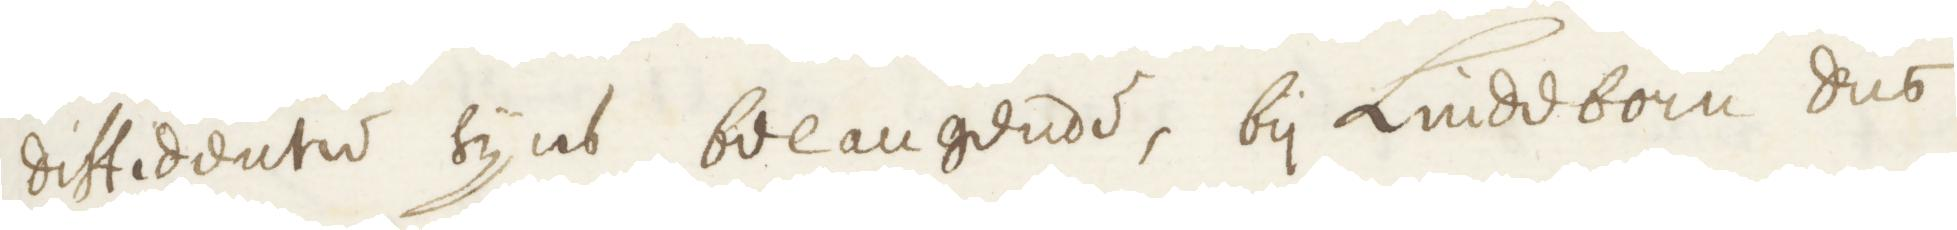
diffidentie sijns belangende, bij Lindeborn dus
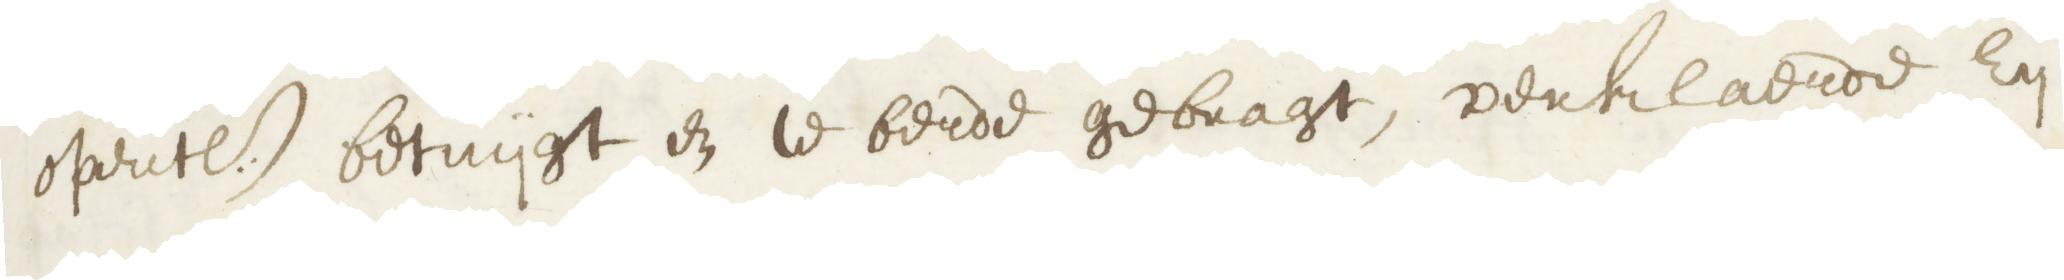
opentlijk betuijgt en te berde gebragt, verklaerde hij
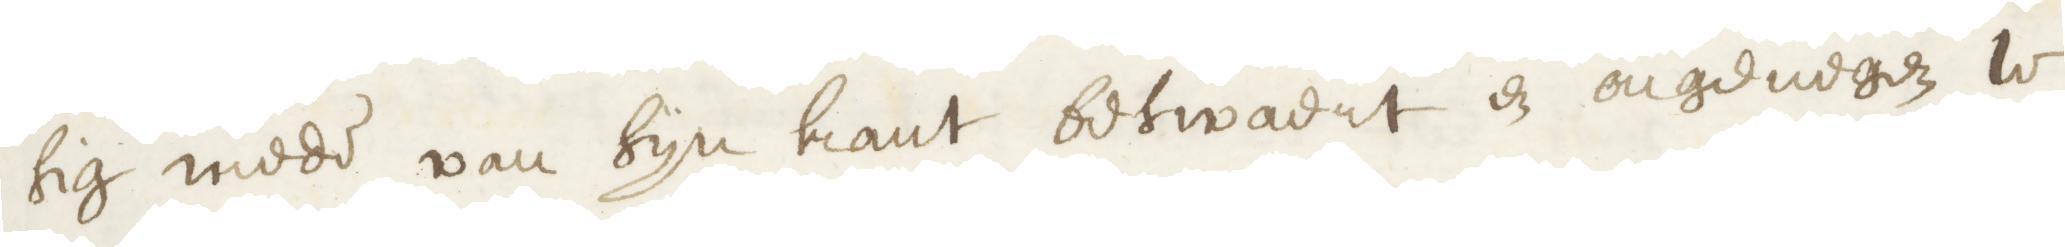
sig mede van sijn kant beswaert en ongenegen te
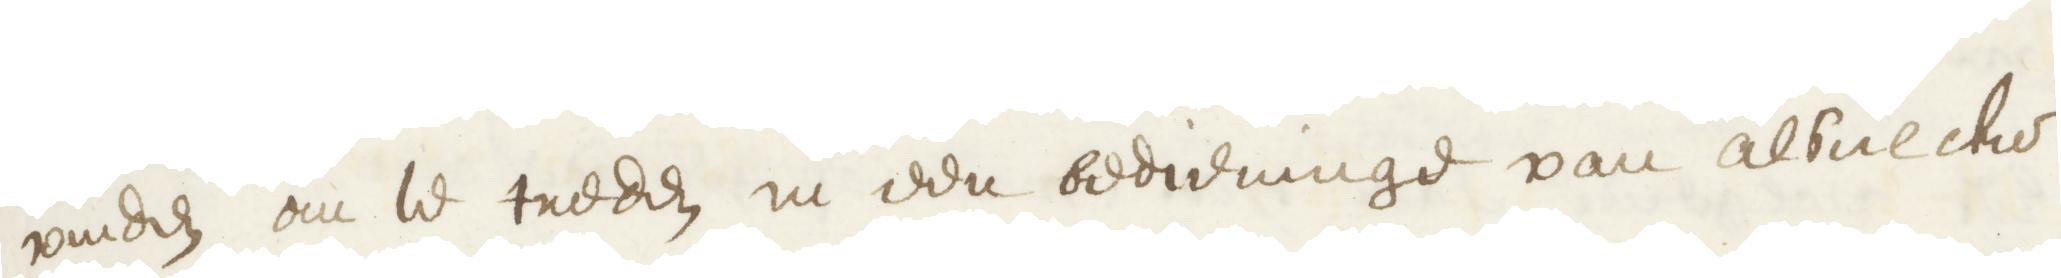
vinden om te treden in een bedieninge van alsulcke
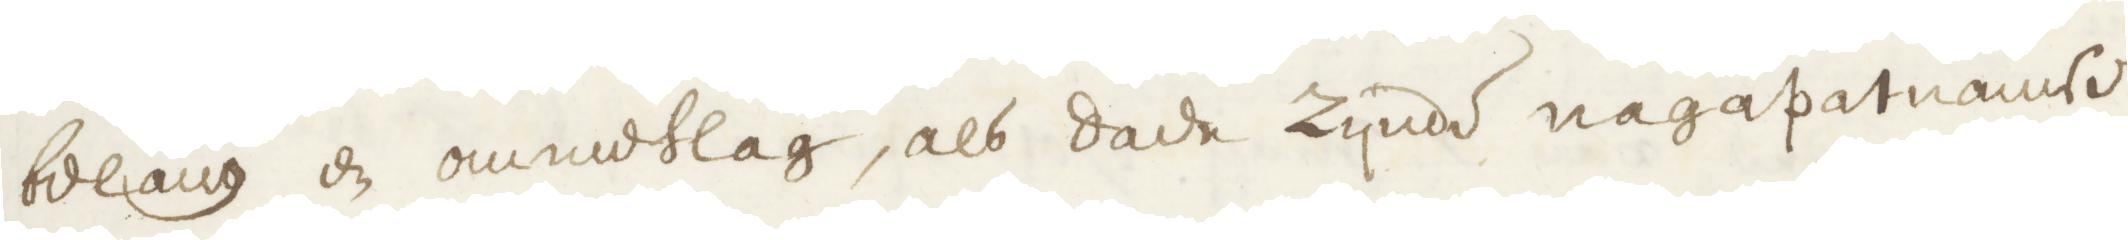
belang en ommeslag, als daer zijnde nagapatnamse
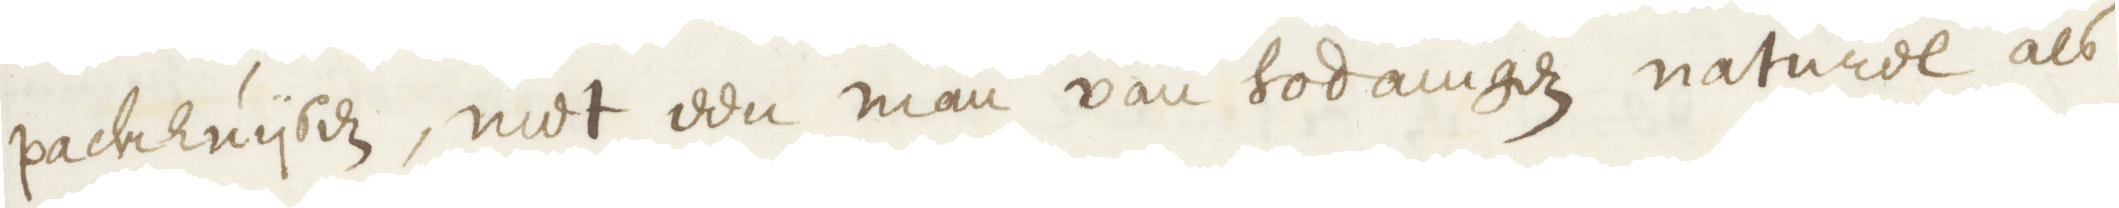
packhuijsen, met een man van sodanigen naturel als
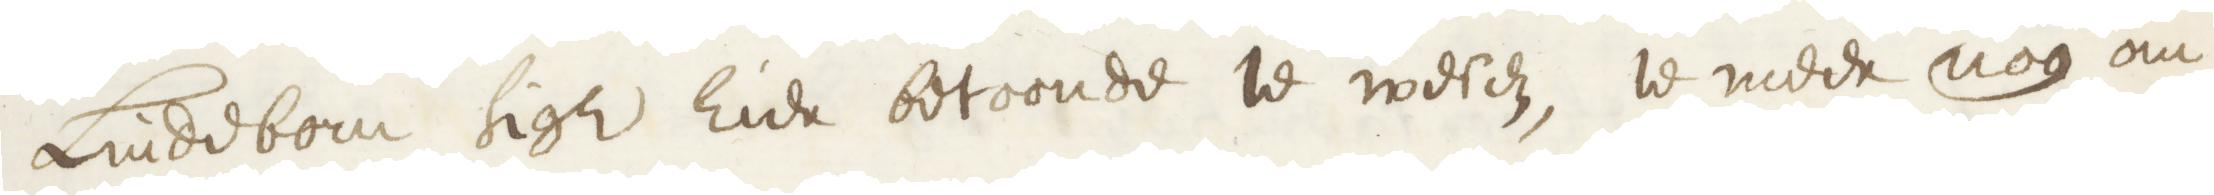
Lindeborn sigh hier betoonde te wesen, te meer nog om
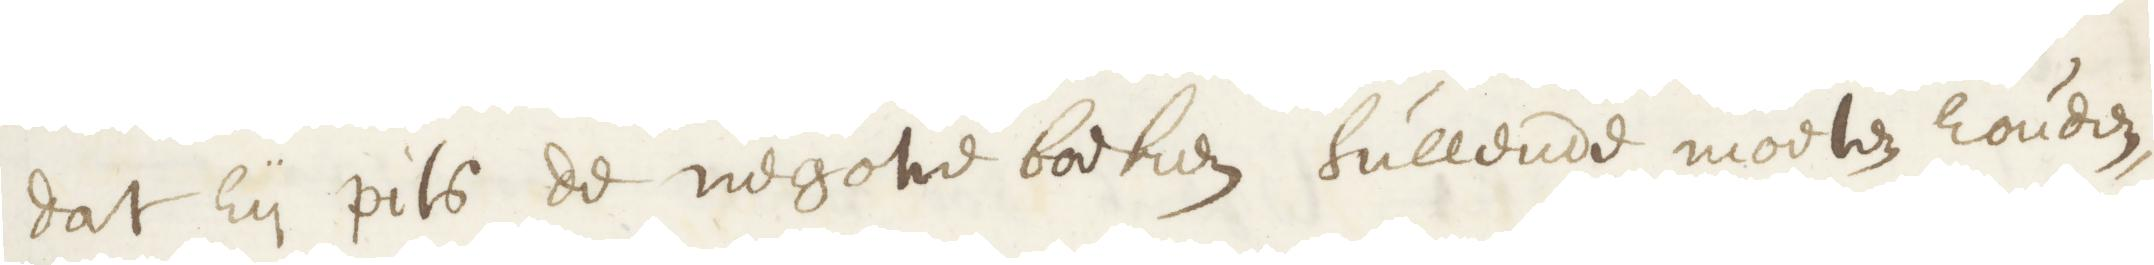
dat hij pits de negotie boeken sullende moeten houden,
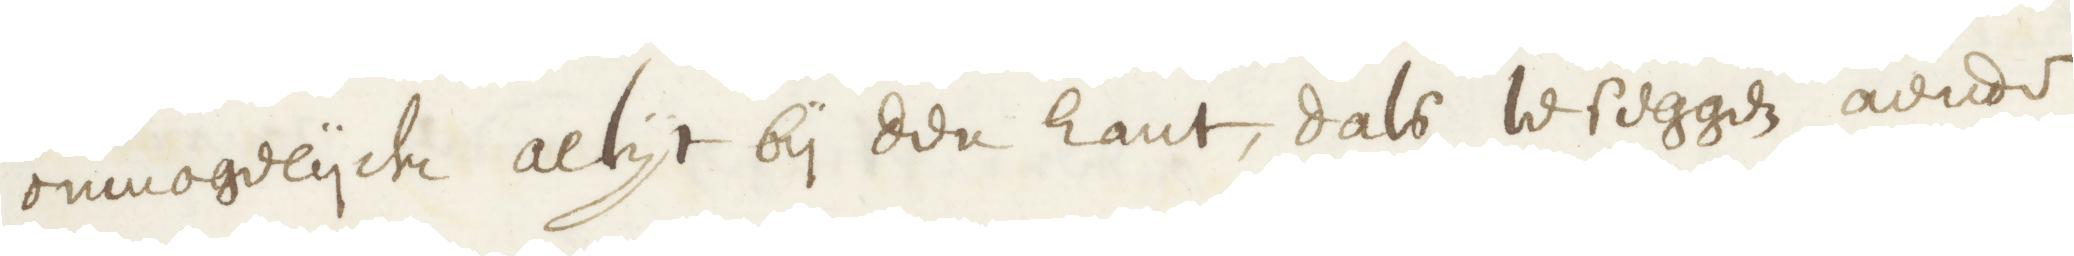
onmogelijck altijt bij den hant, dats te seggen aende
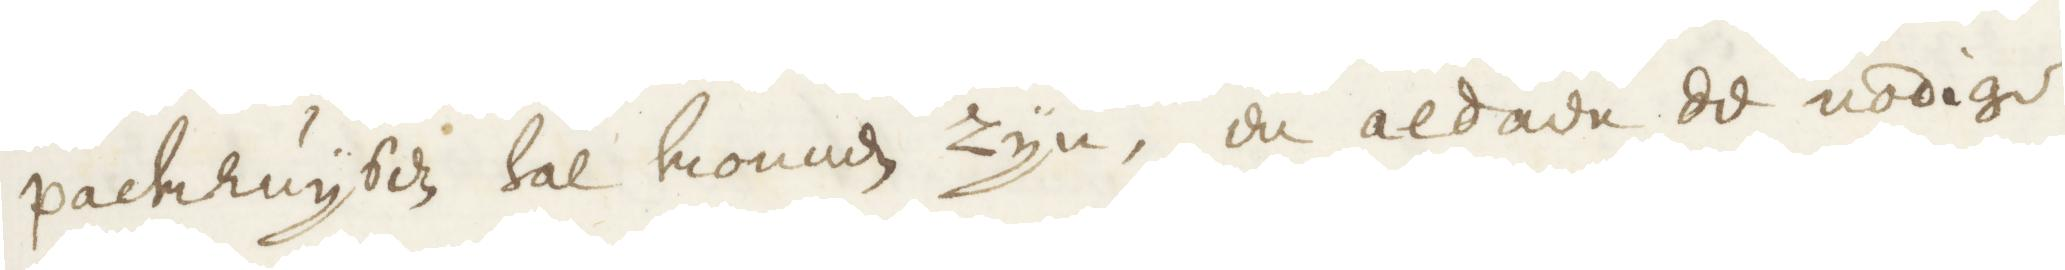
packhuijsen sal konnen zijn, en aldaer de nodige
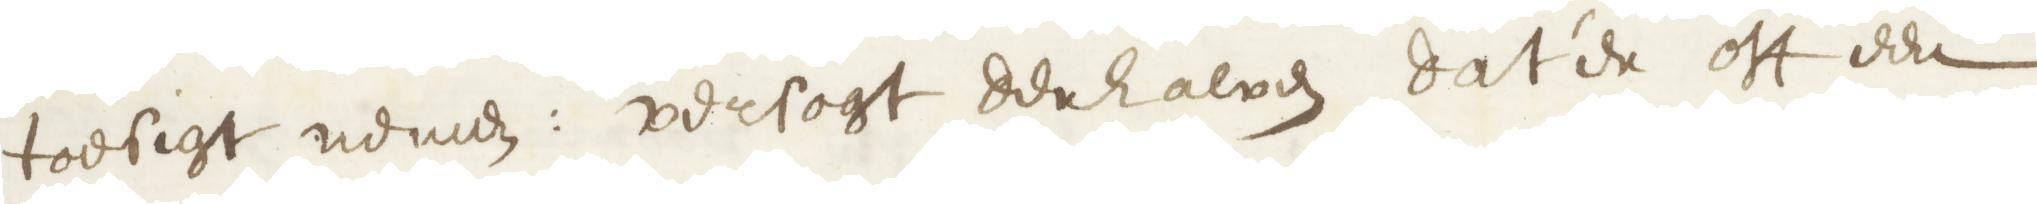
toesigt nemen: versogt derhalven dat 'er off een
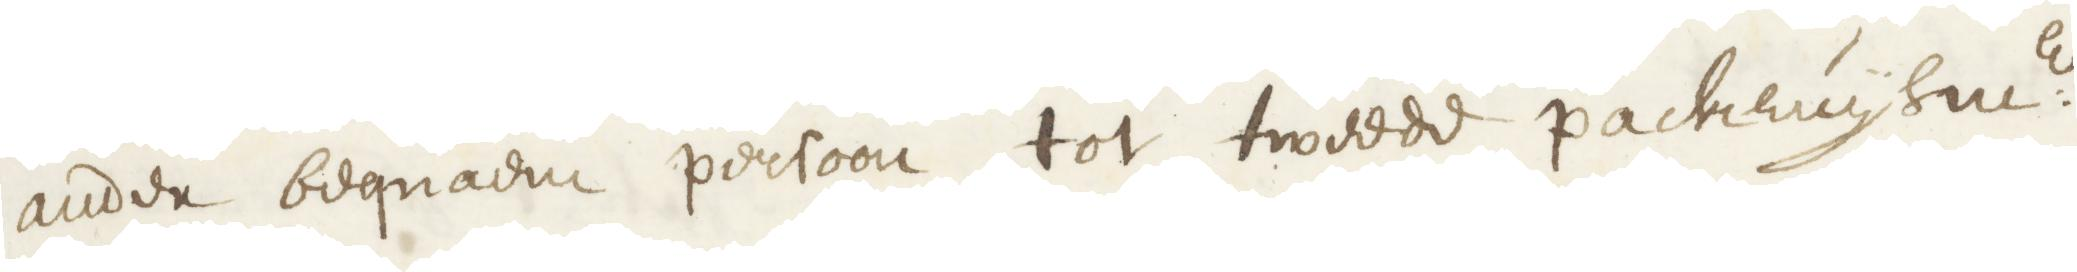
ander bequaem persoon tot tweede packhuijsm:r
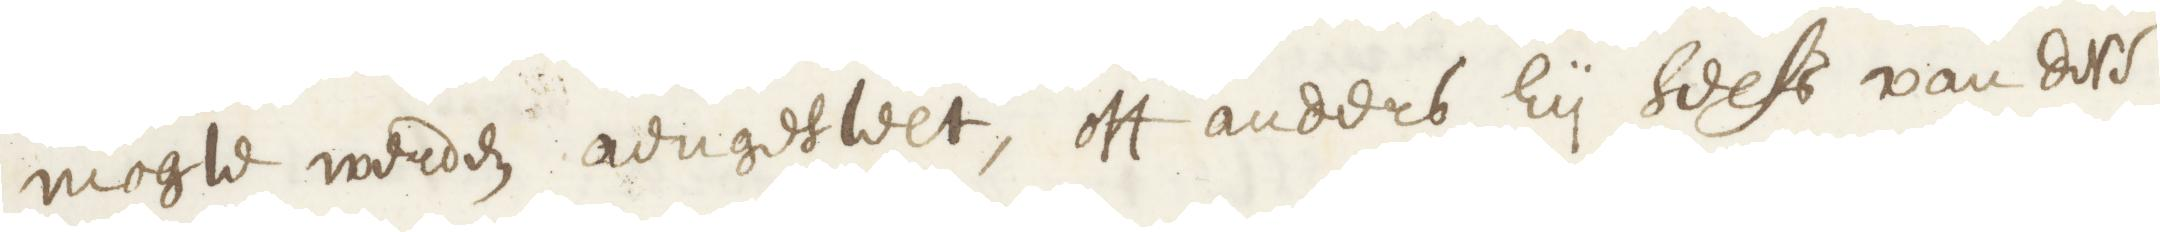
mogte werden aengestelt, off anders hij selfs van dese
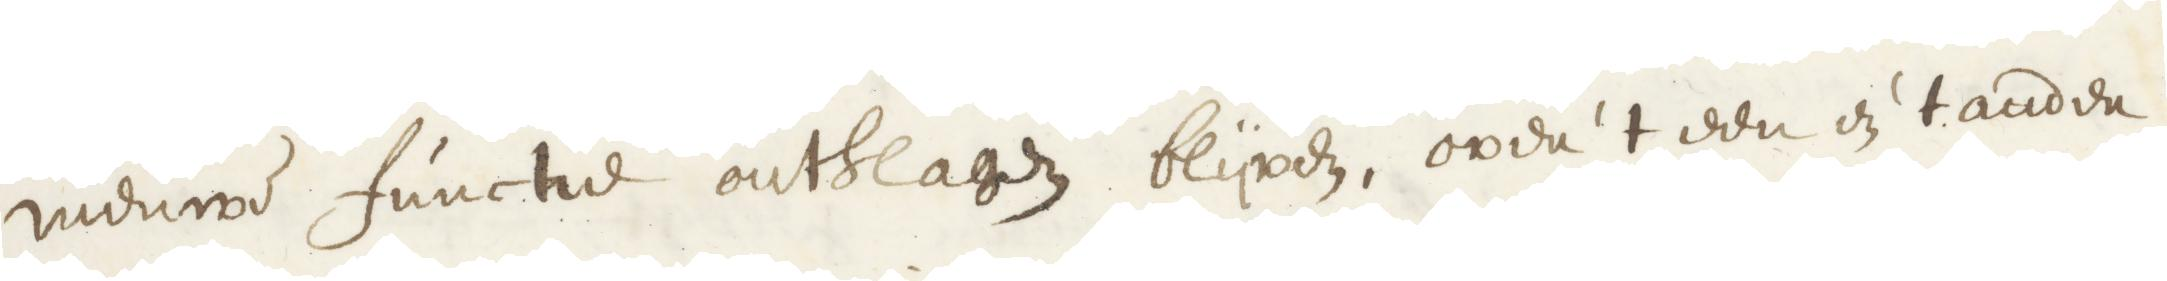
nieuwe functie ontslagen blijven, over ’t een en ’t ander
